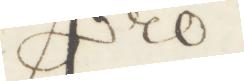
pro
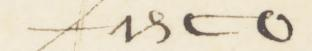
fisco
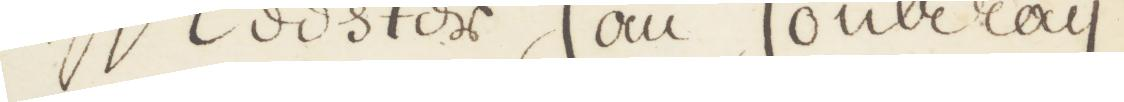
Meester Jan Jonkraij
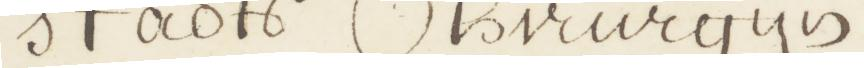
stadts Chirurgijn
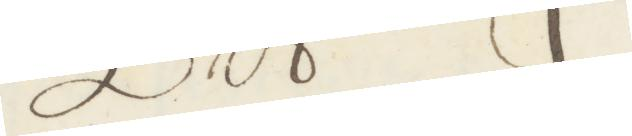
Lit J
